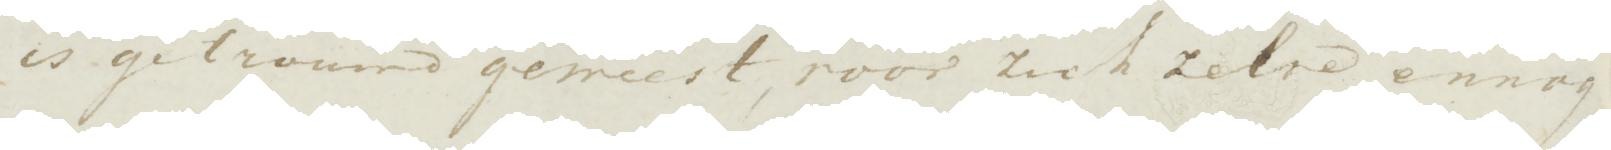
is getrouwd geweest, voor zich zelve en nog
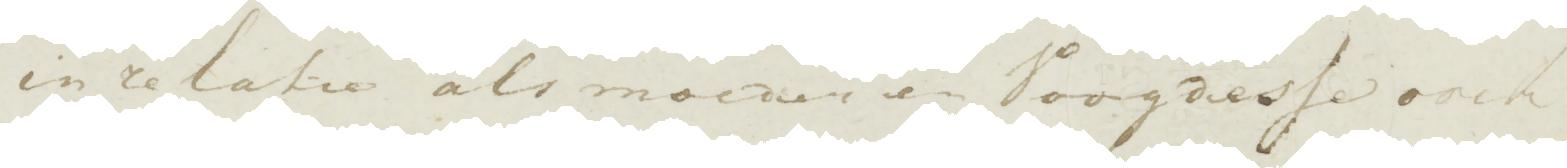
in relatie als moeder en Voogdesse oock
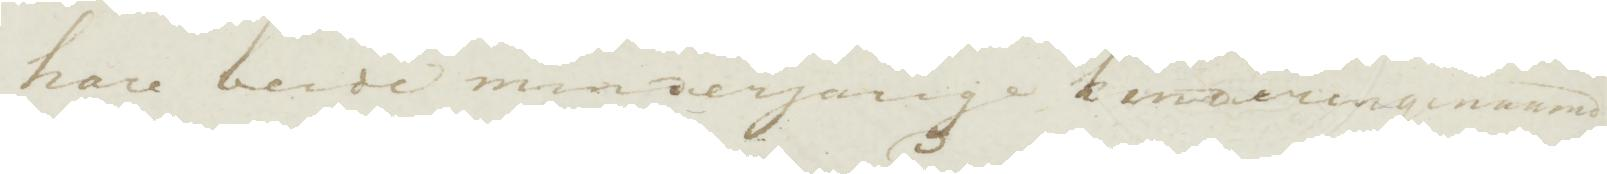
hare beide minderjarige kinderen genaamd
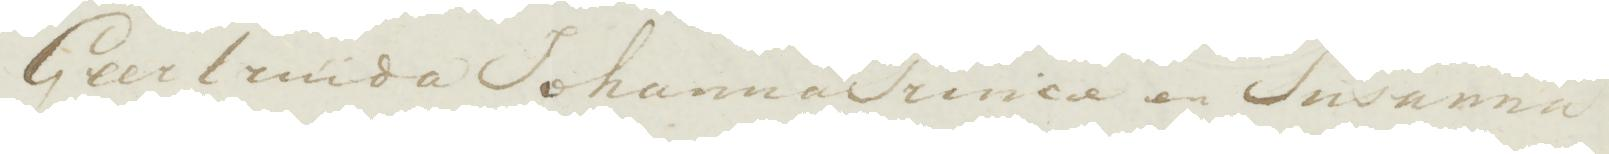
Geertruida Johanna Prince en Susanna
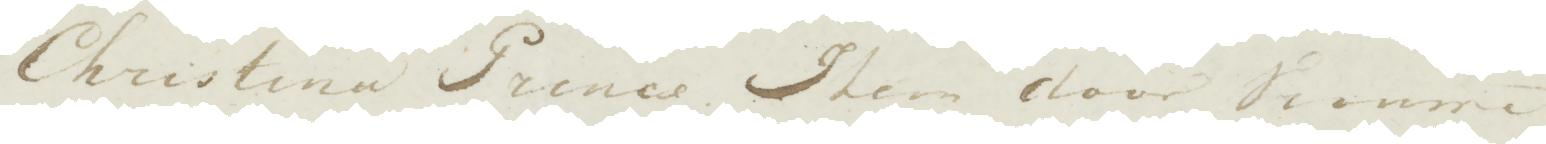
Christina Prince, Jtem door Vrouwe
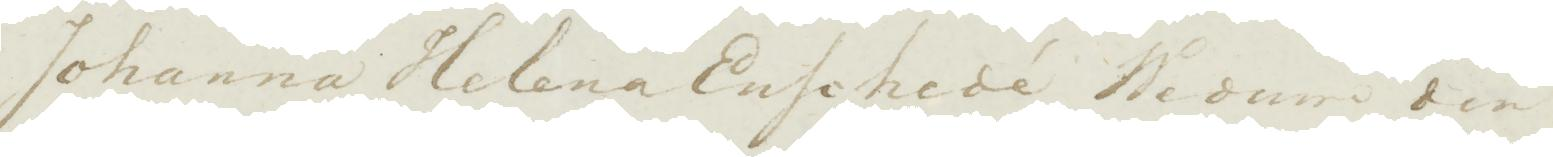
Johanna Helena Enschedé, Weduwe den
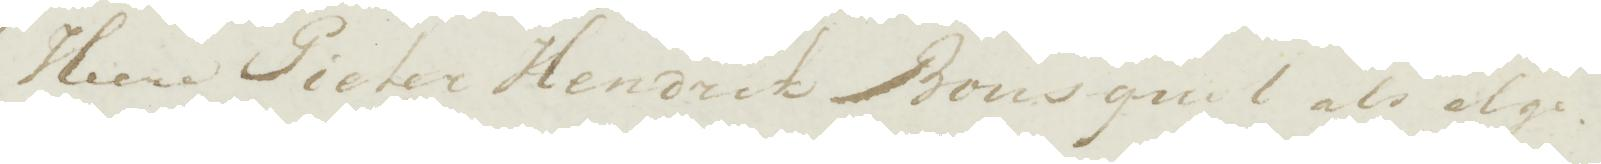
Heere Pieter Hendrik Bousquet als alge.
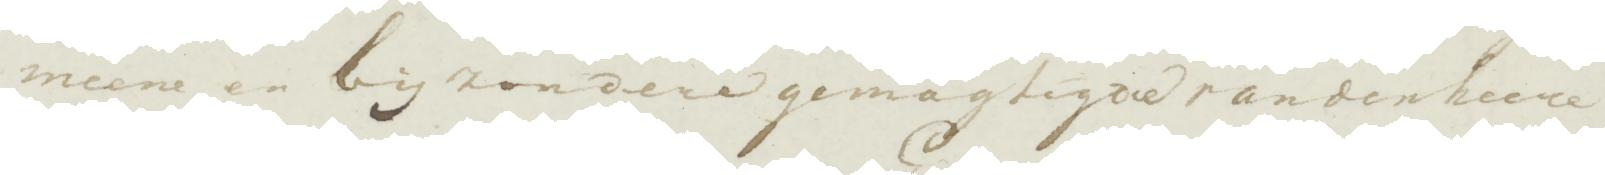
meene en bijzondere gemagtigde van den heere
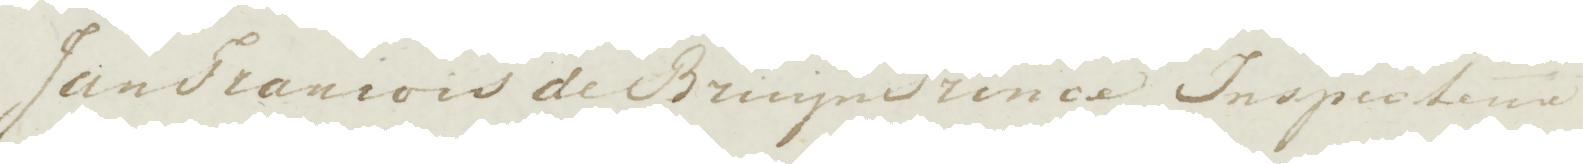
Jan Frarcois de Bruijn Prince, Jnspecteur
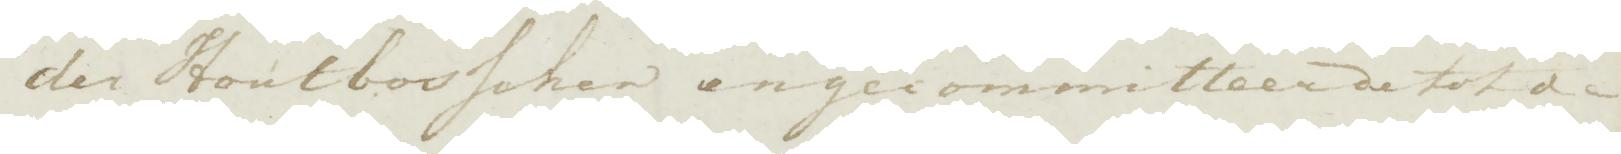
der Houtbosschen en gecommitteerde tot de
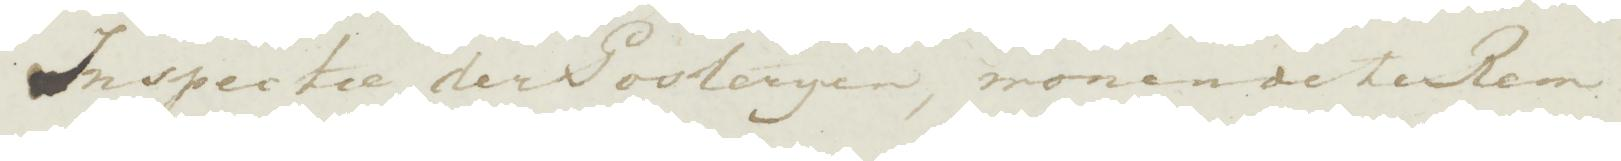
Jnspectie der Posteryen, wonende te Rem
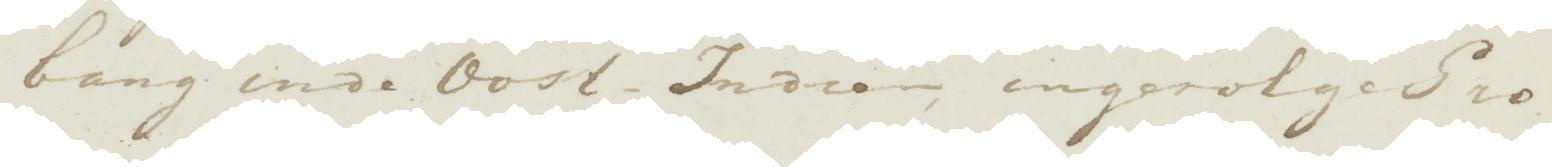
bang inde Oost-Jndien, ingevolge Pro
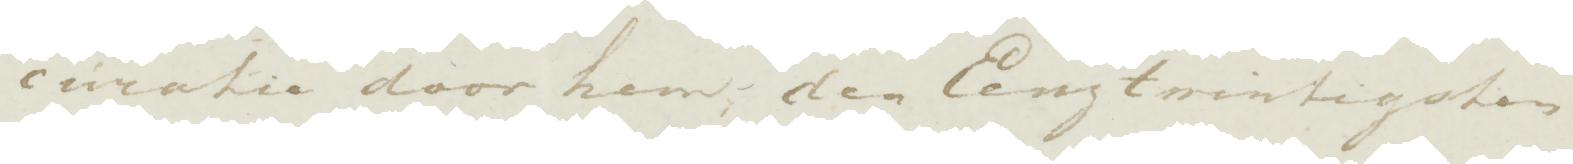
curatie door hem, den Eenen twintigsten
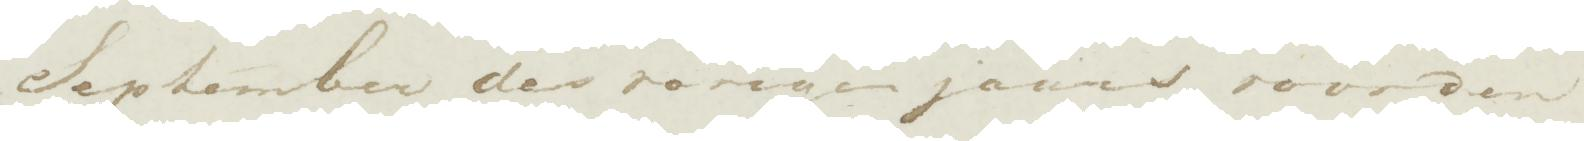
September des vorigen jaars voor den
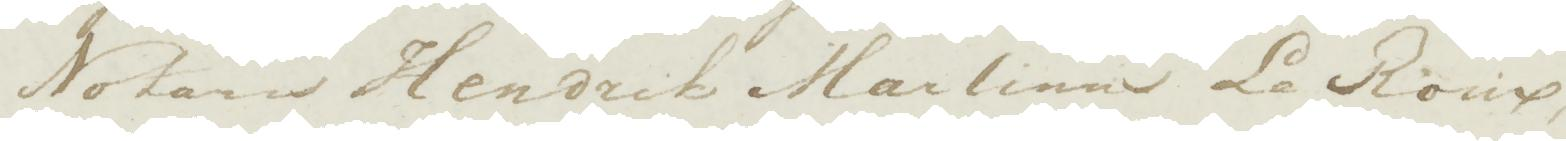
Notaris Hendrik Martinus Le Roux,
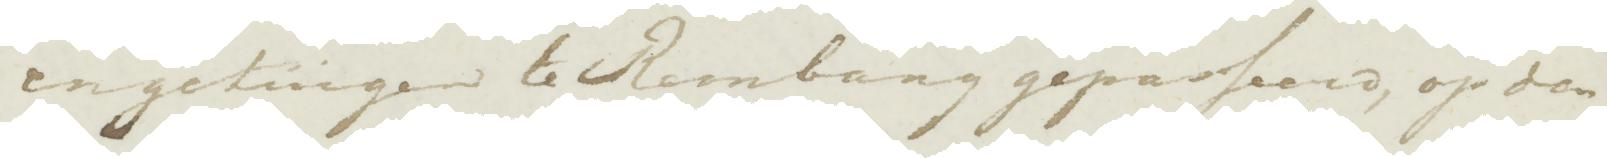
en getuigen te Rembang gepasseerd, op den
